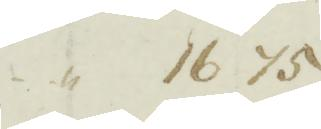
„ 16 75
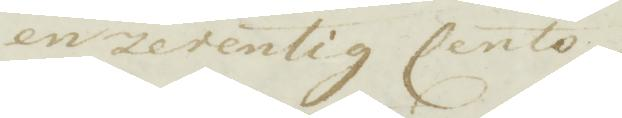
en zeventig Cents - - - - - - - - - - - -
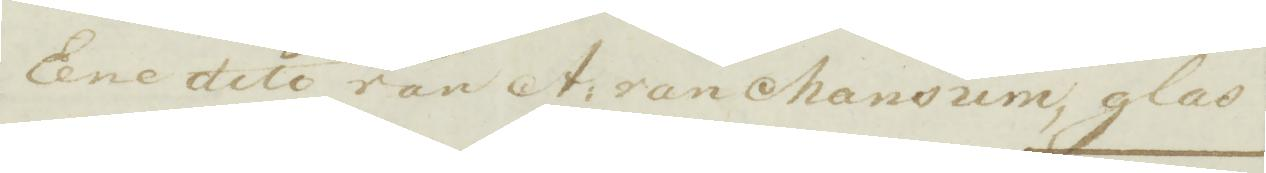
Eene dito van A: van Marsum, glas
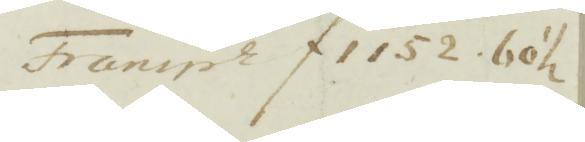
Transp=e ƒ 1152 . 40½
